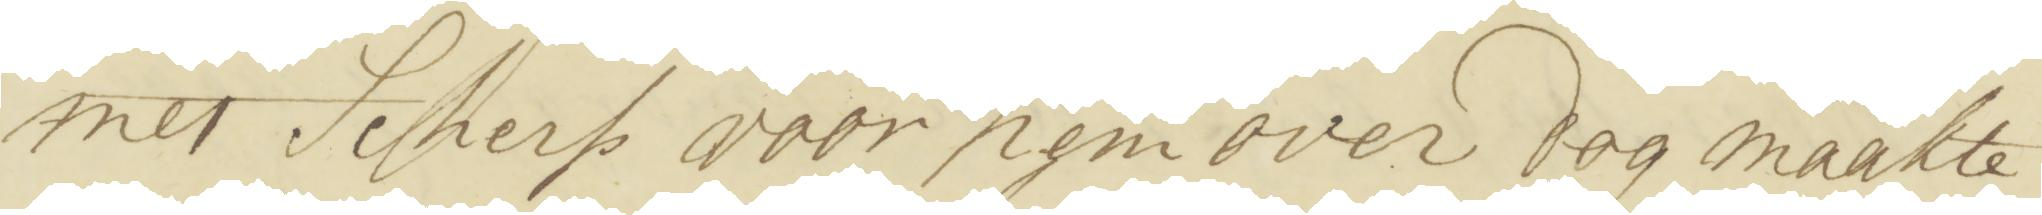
met scherp voor hem over dog maakte
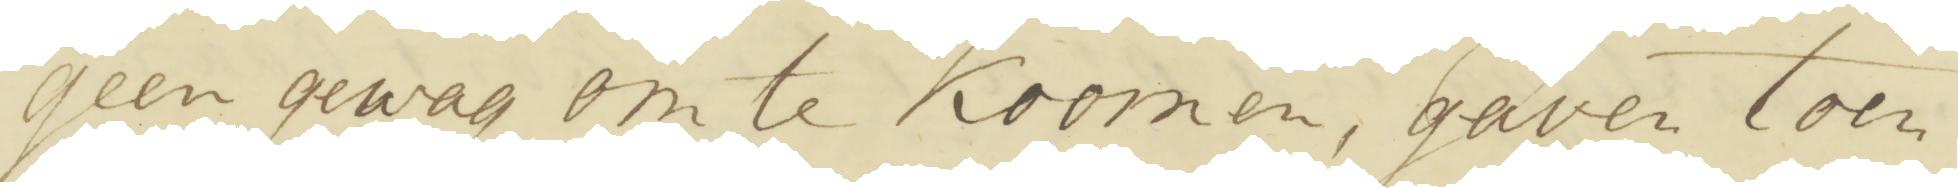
geen gewag om te koomen, gaven toen
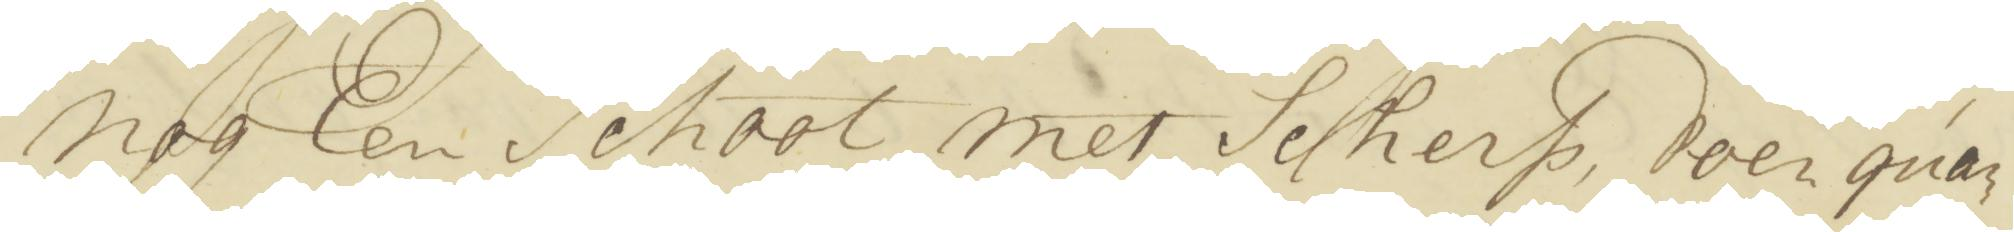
nog Een schoot met scherp, doen quan
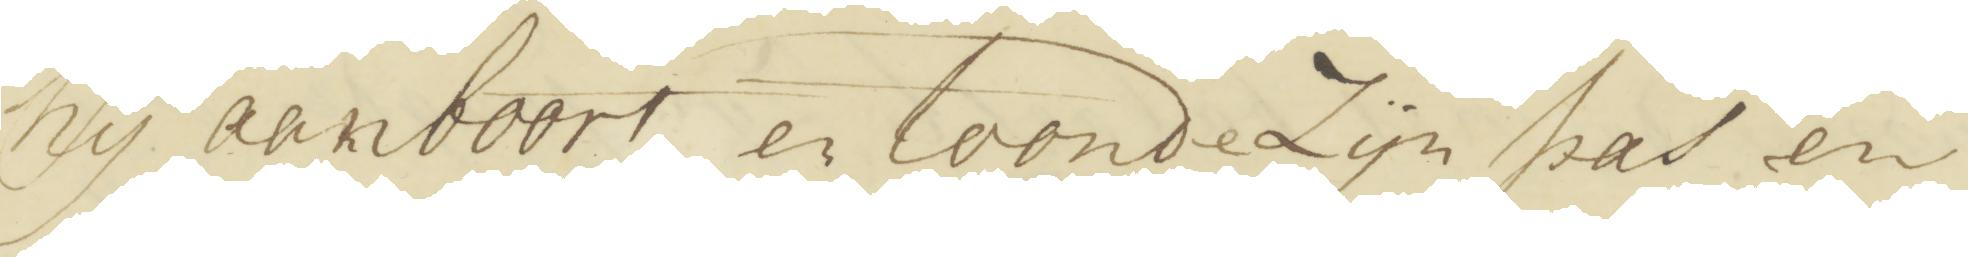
hij aanboort en toonde zijn pas en
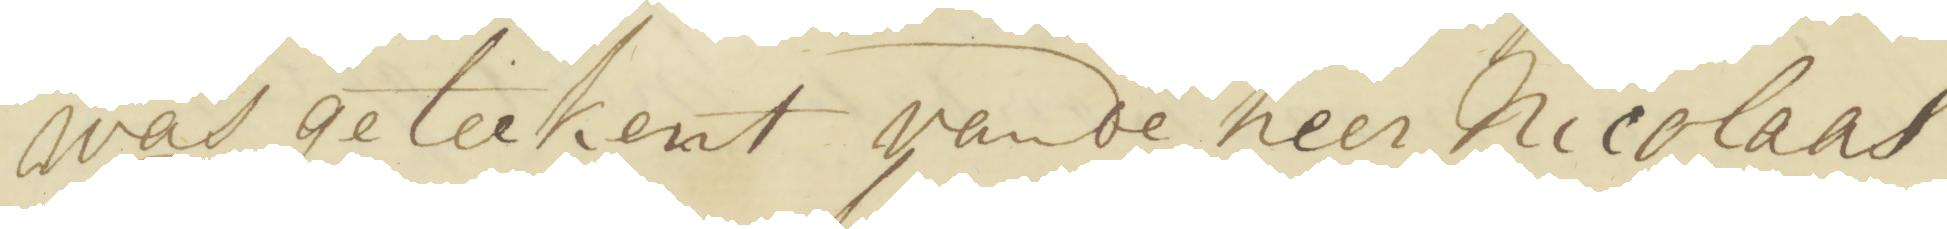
was geteekent van de heer Nicolaas
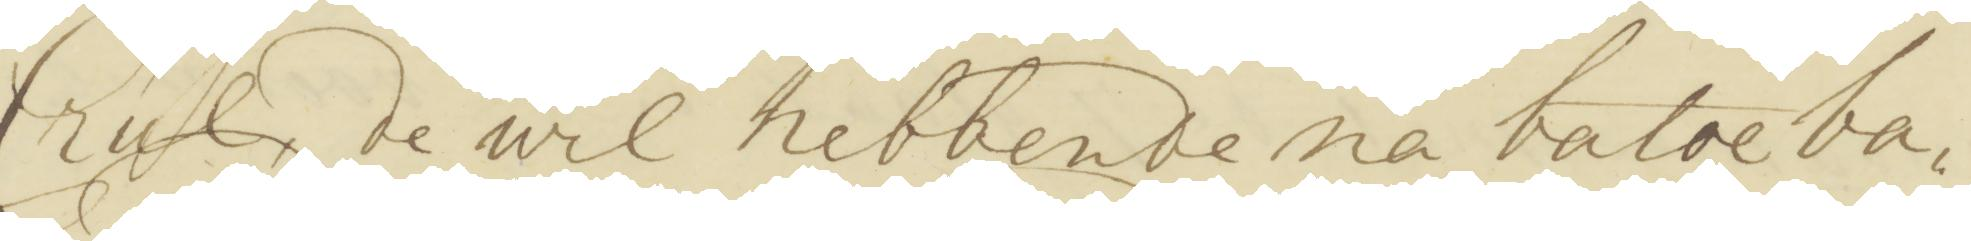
Crul, de wil hebbende na batoe ba„
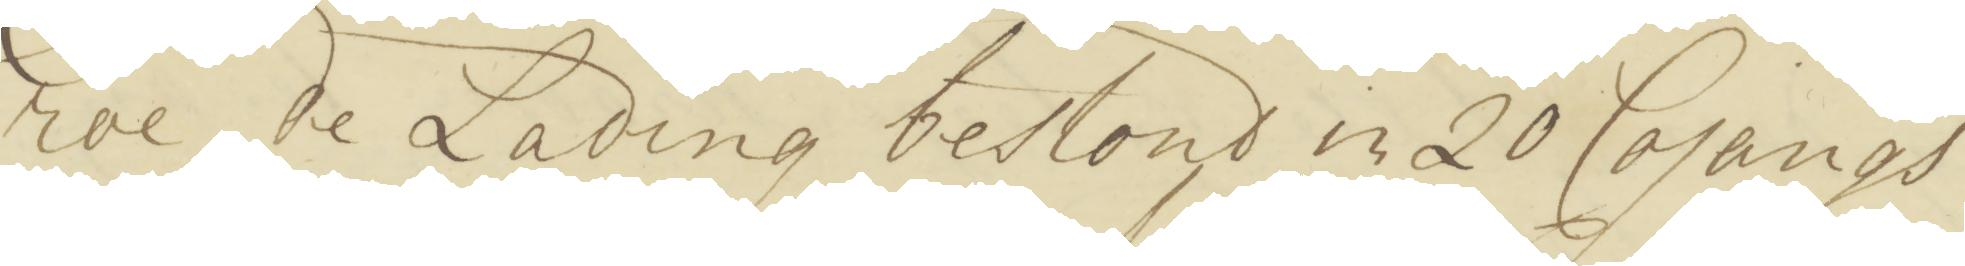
hoe, de Lading bestond in 20 cojangs
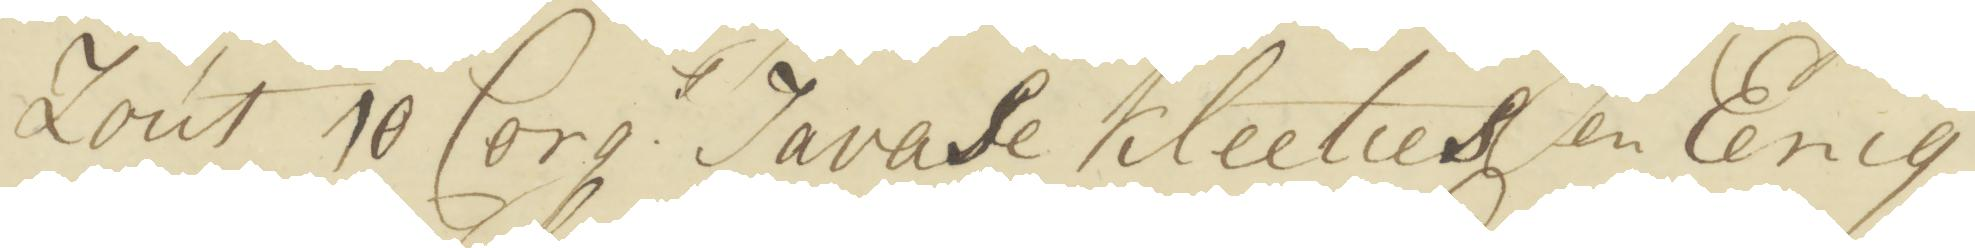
zout 10 corg.s Iavase kleeties en Eenig
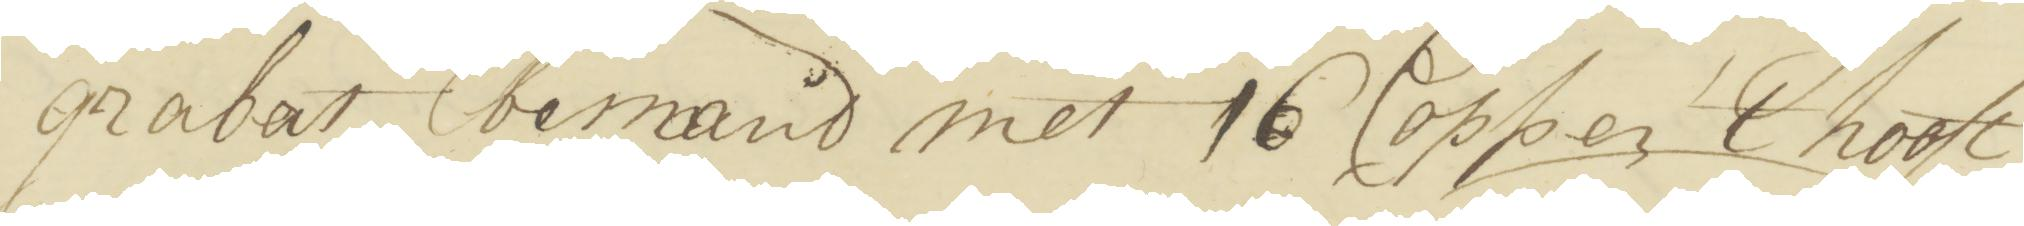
grabat, bemand met 16 Coppen 't hooft
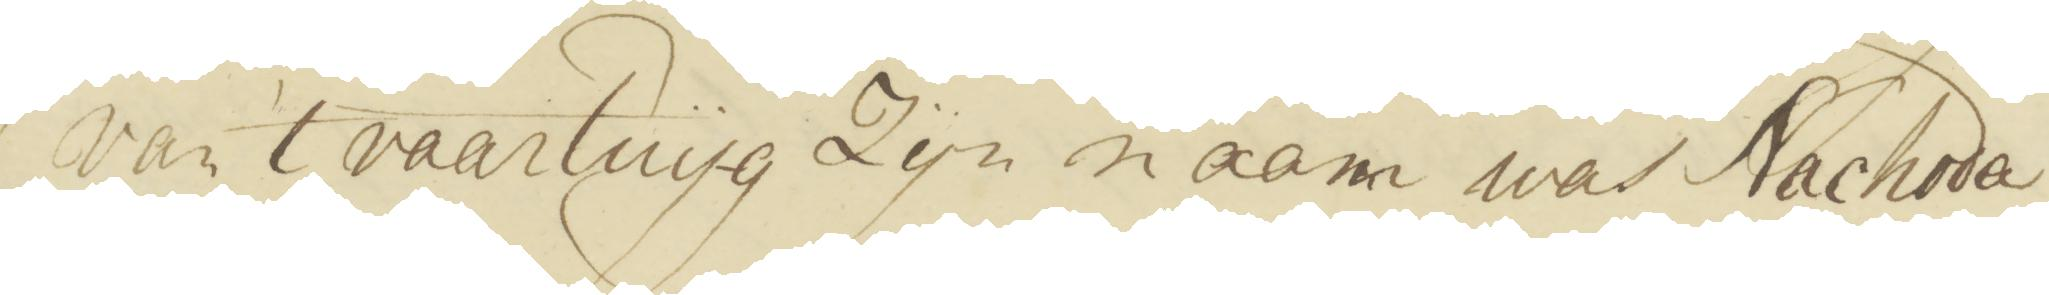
van 't vaartuijg zijn naam was Nachoda
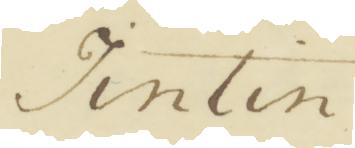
Iintin
